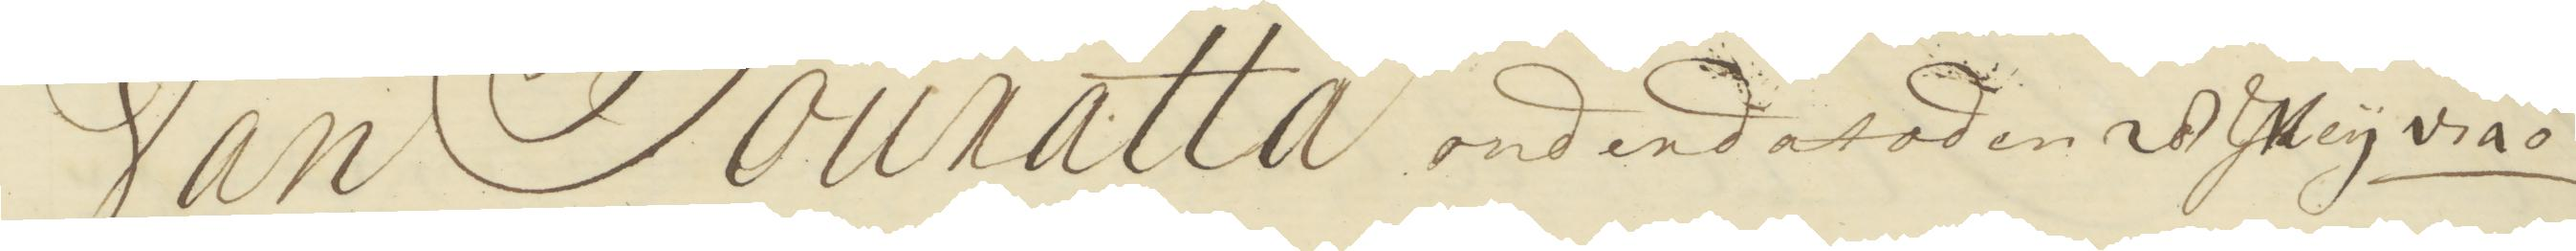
Van Souratta onderdatoden 28 Meij 1740
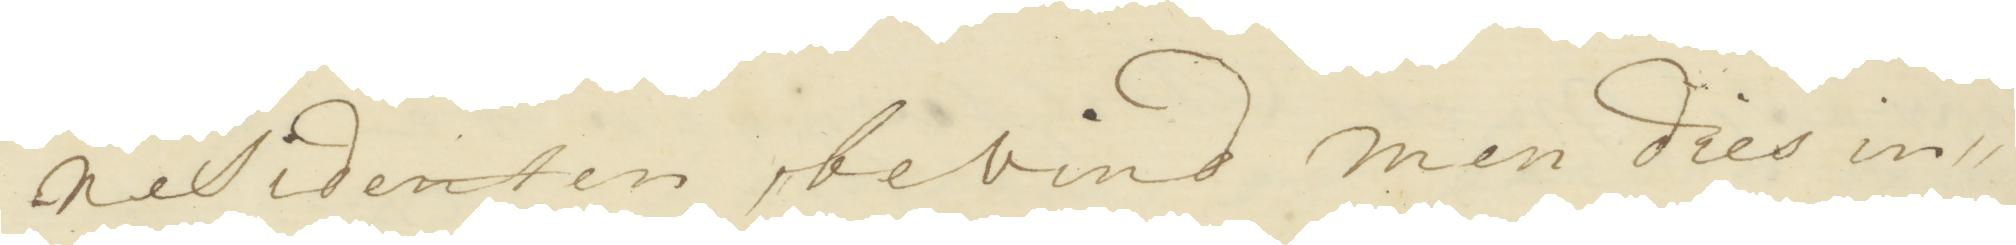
residenten, bevind men dies in„
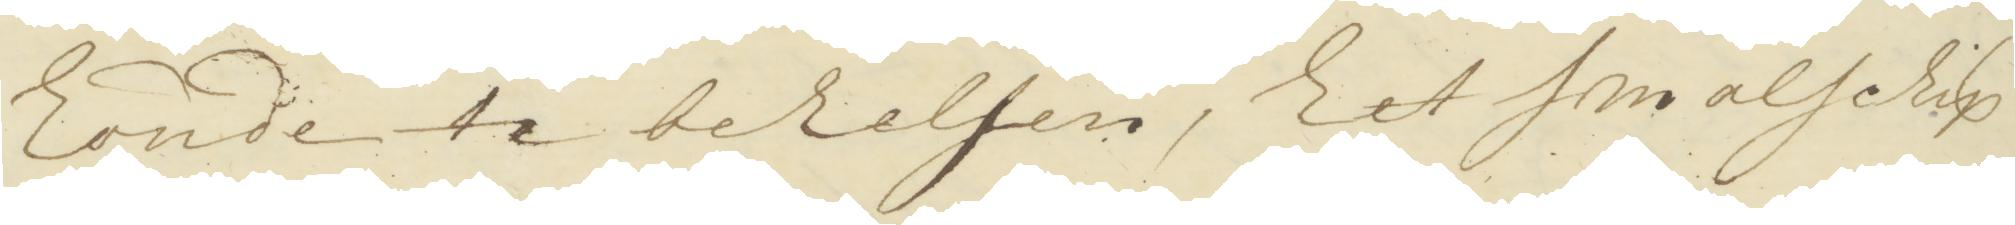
houde te behelfen, het smalschip
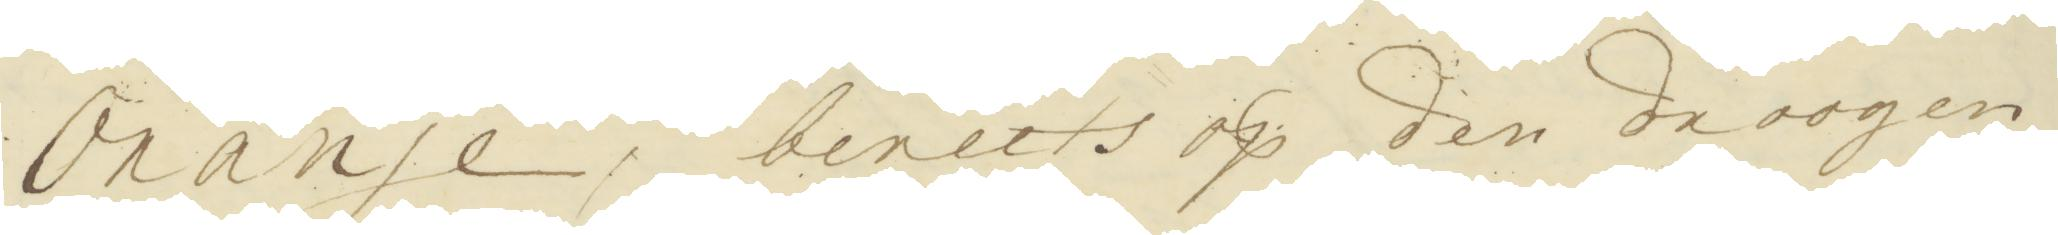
Oranje, bereets op den droogen
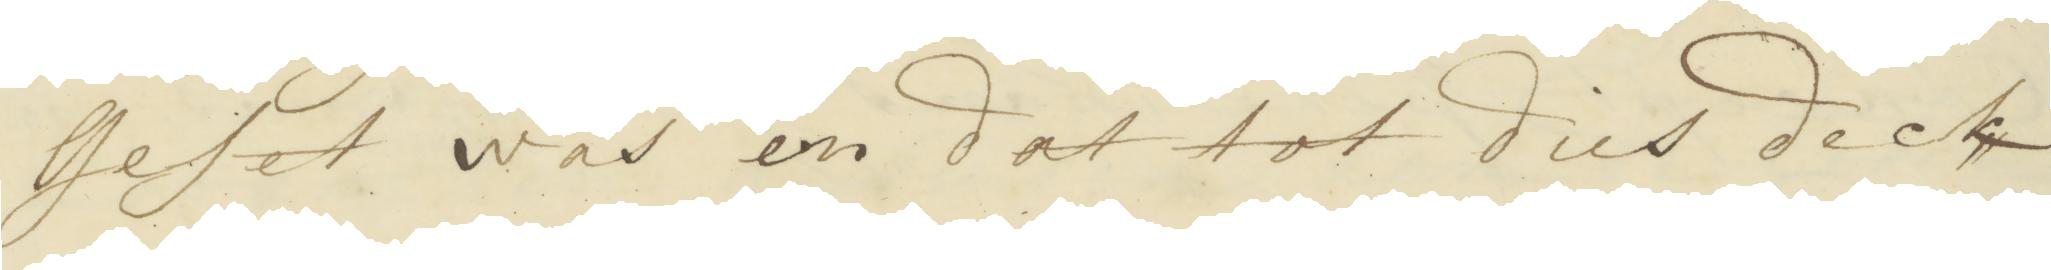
Geset was en dat tot dies deck„
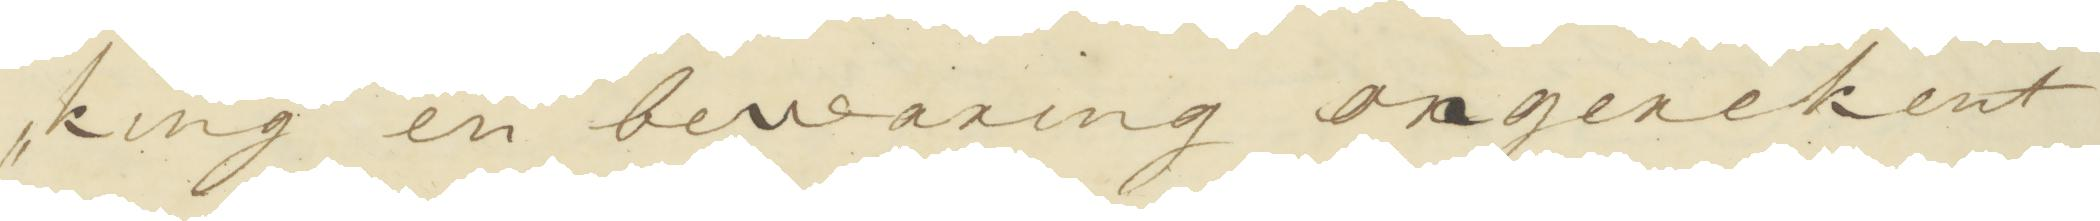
„king en bewaring ongerekent
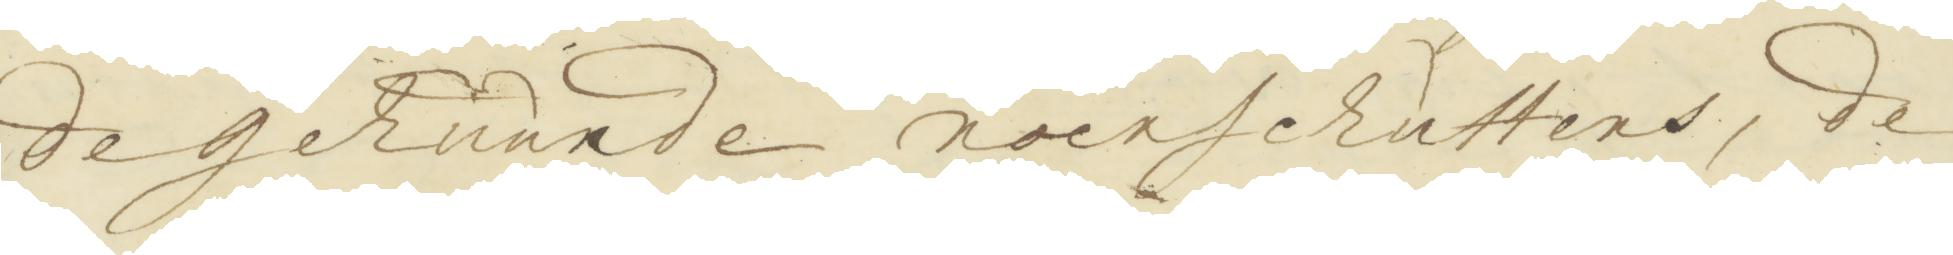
de gehuurde voerschutters, de
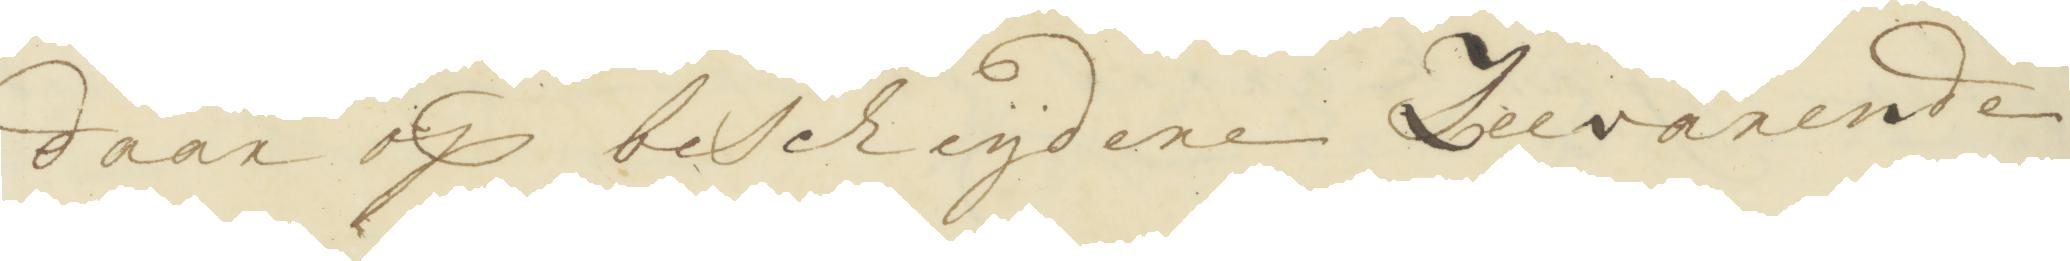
daar op bescheijdere zeevarende
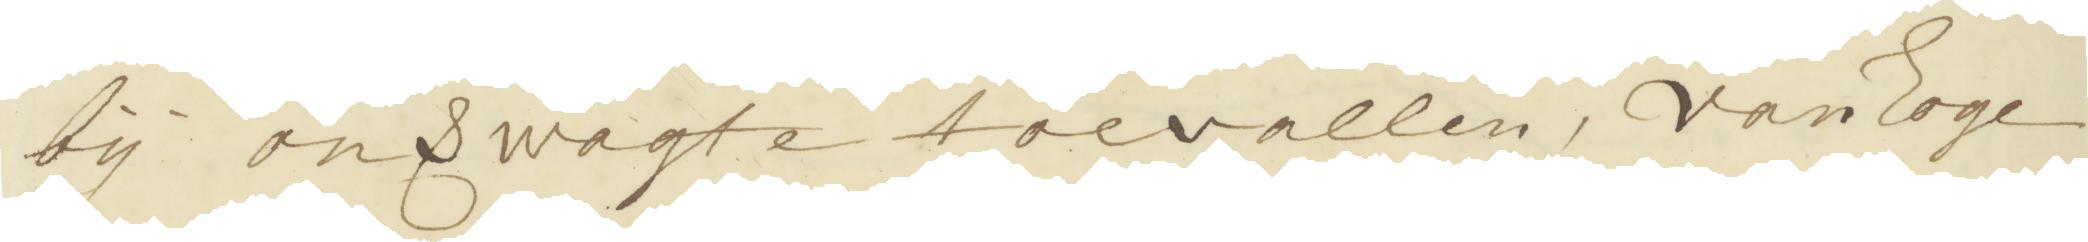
bij onverwagte toevallen, van hoge
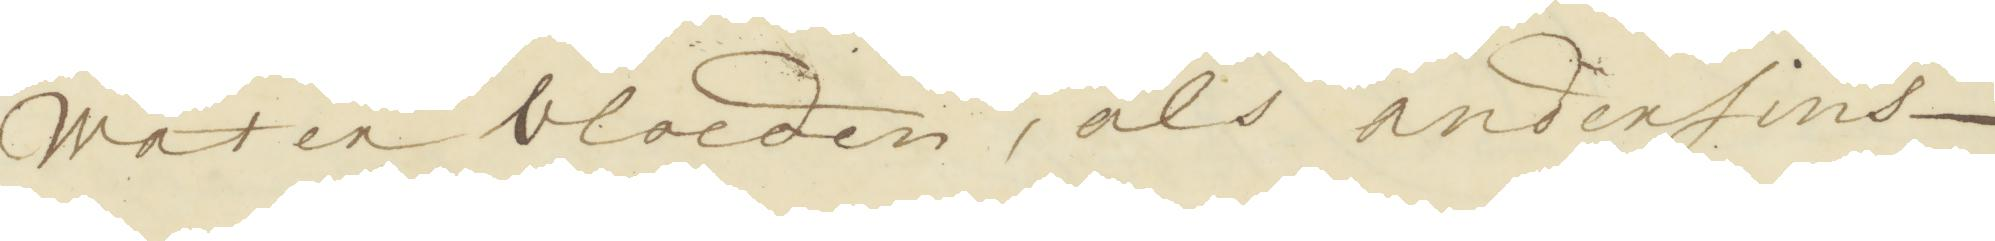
water bloeden, als andersins—
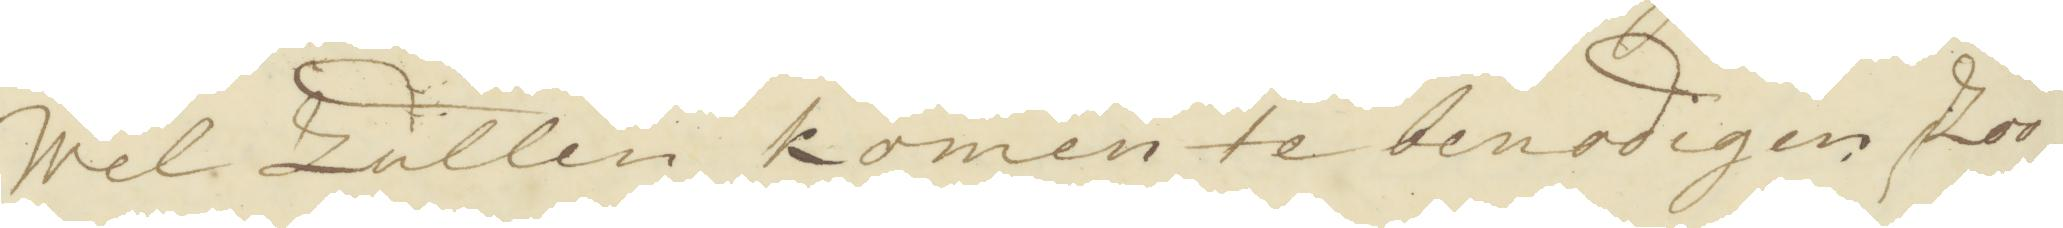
wel zullen komen te benodigen zoo
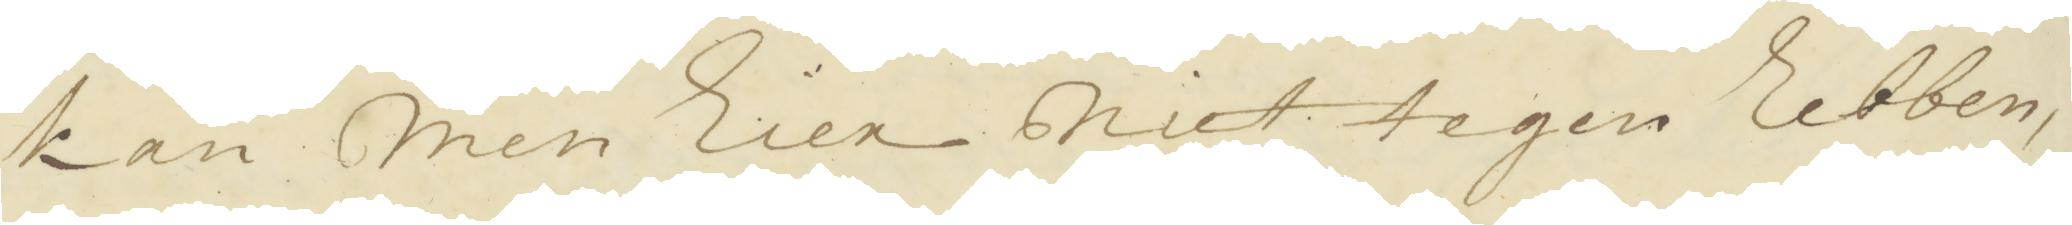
kan men hier niet tegen hebben,
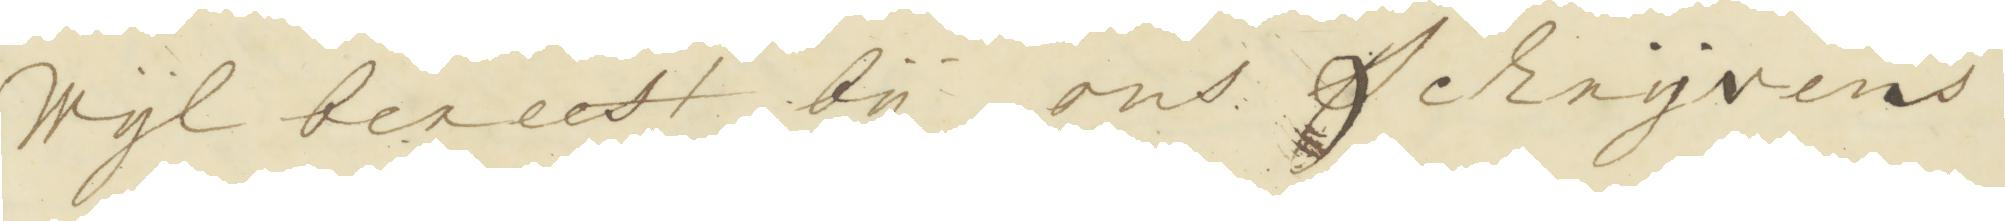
wijl bereest bij ons schrijvens
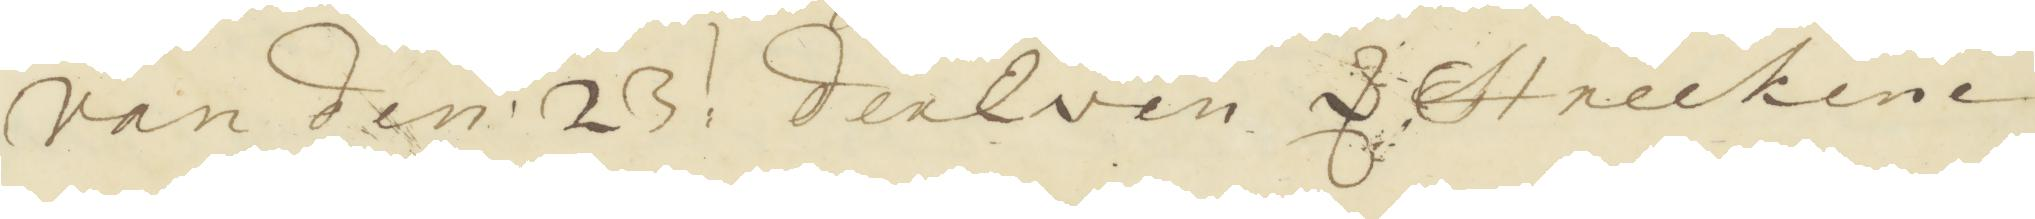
van den 23: der Even verstreekene
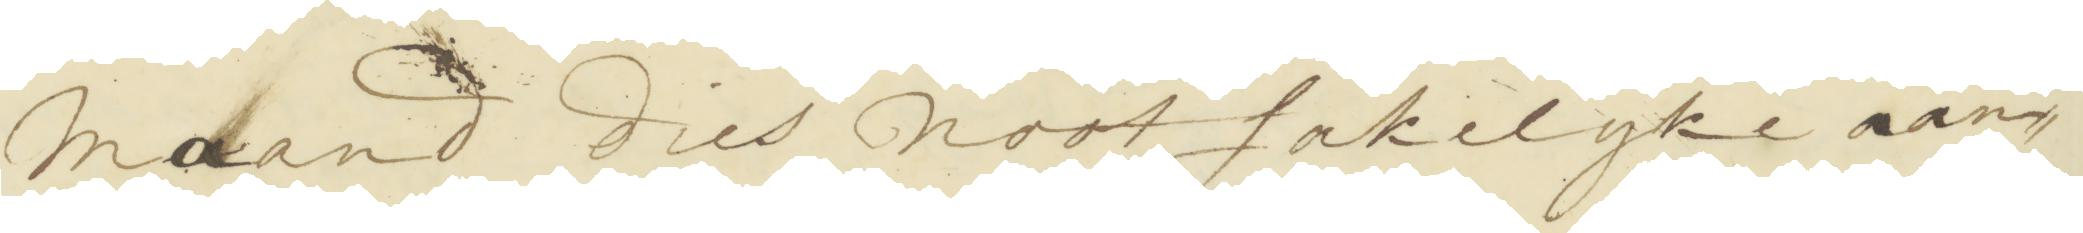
Maand dies nootsakelijke aan„
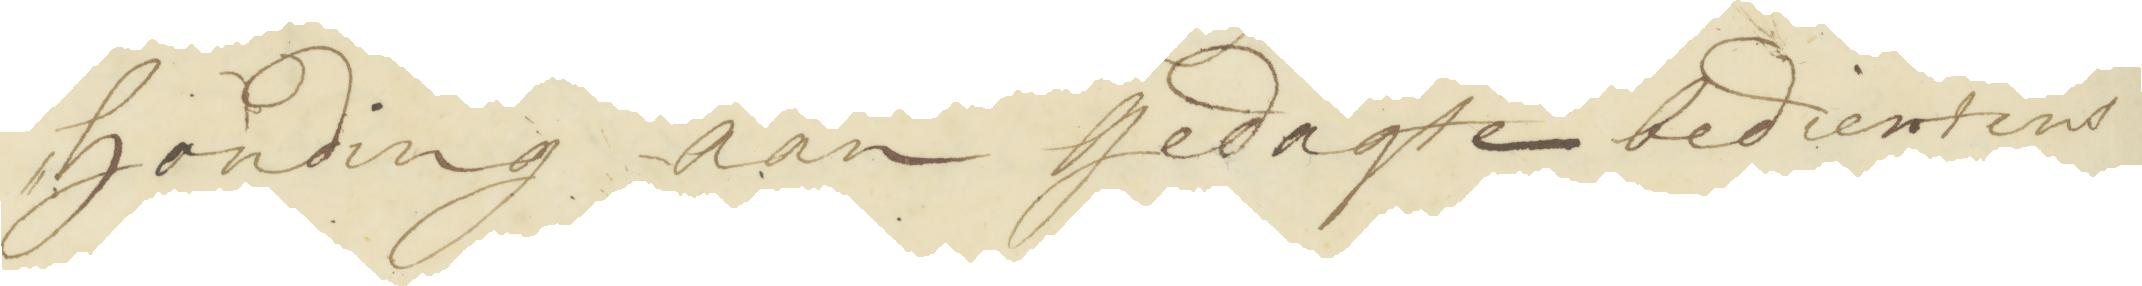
„houding aan Gedagte bedientens
